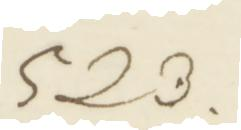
523.
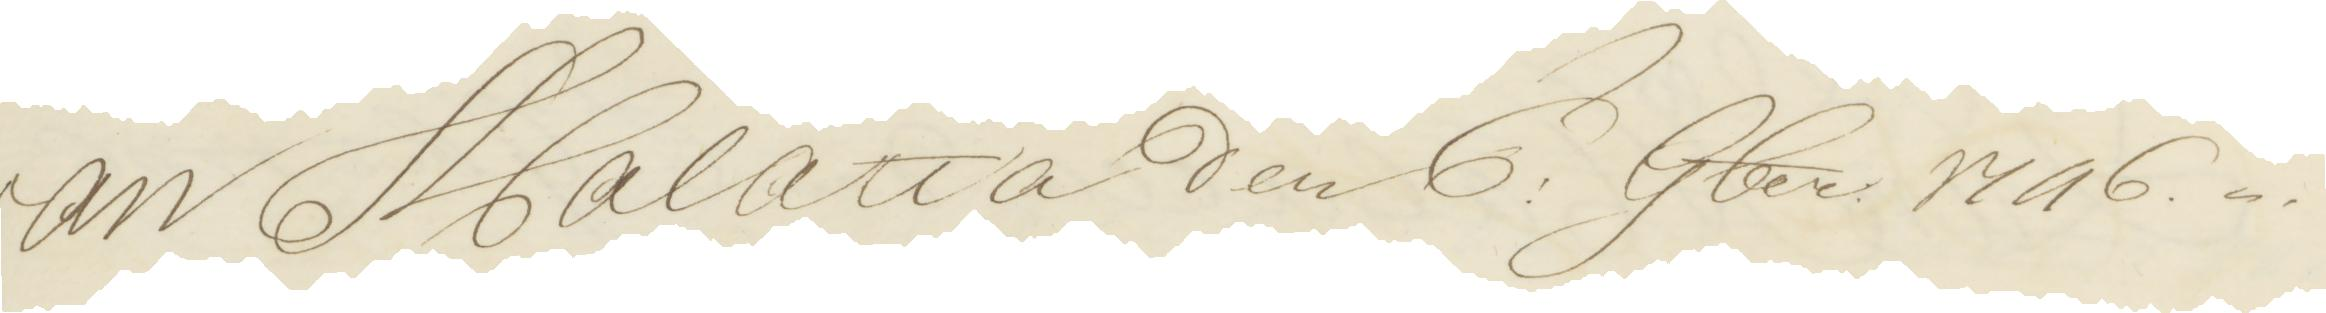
Van Malacca den 6: 9ber: 1746.
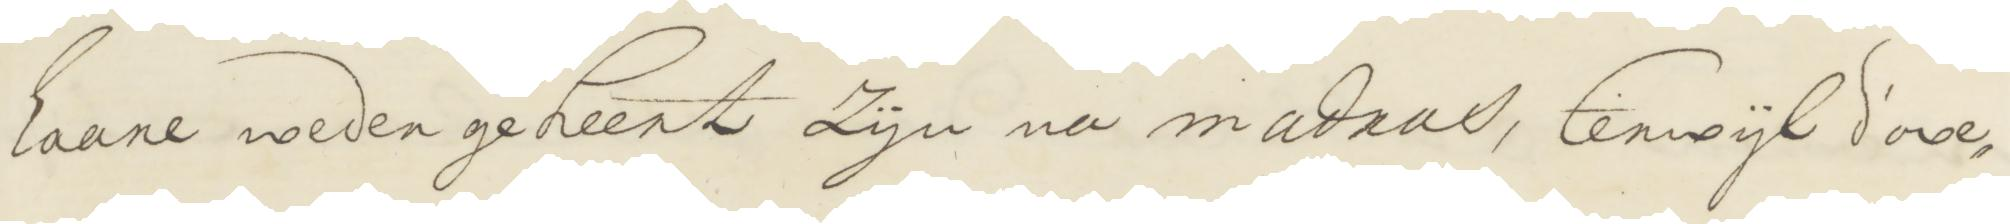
haare weder gekeert Zijn na madras, terwijl d'ove„
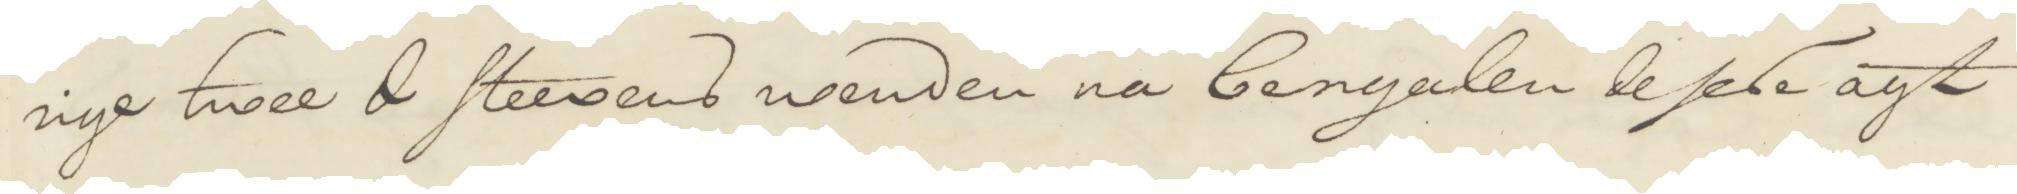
rige twee de steevens wenden na bengalen desese agt
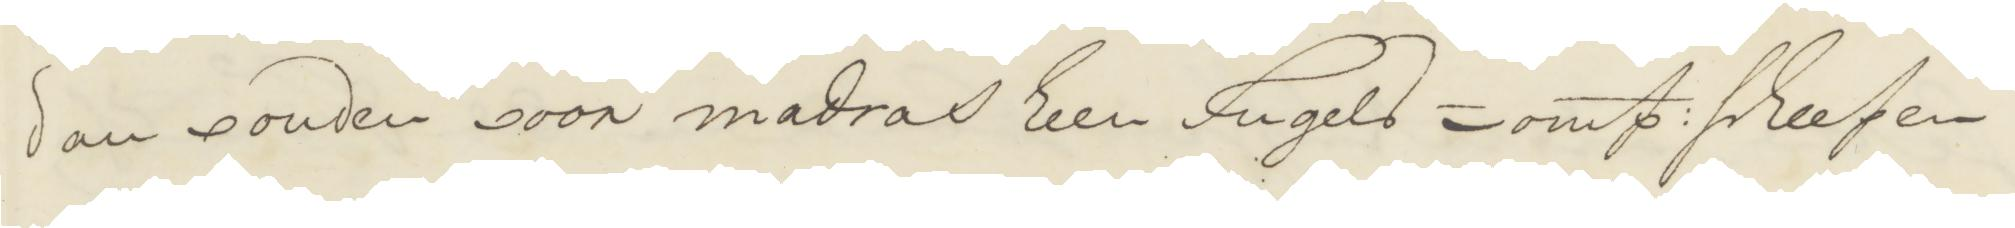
dan vonden voor madras heen Engels comp: scheepen
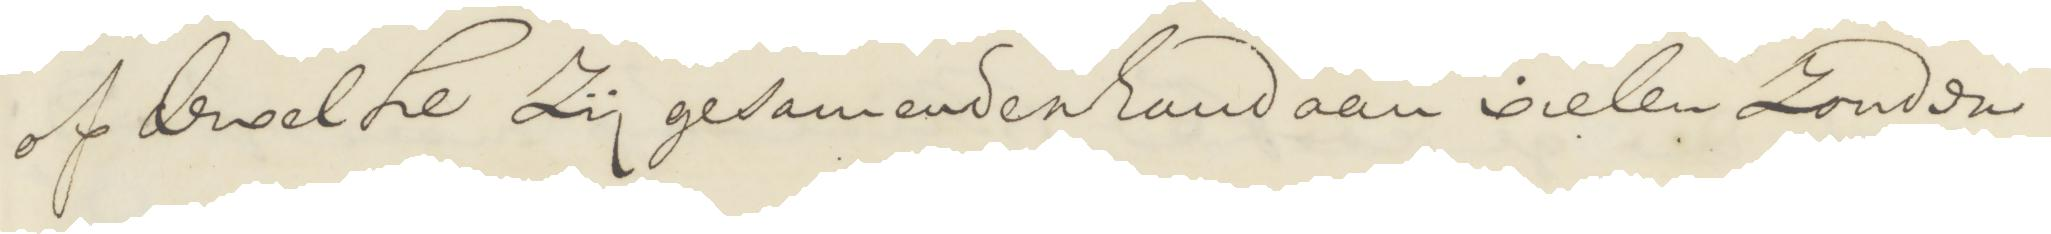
op dewelke Zij gesamender hand aan vielen Zonder
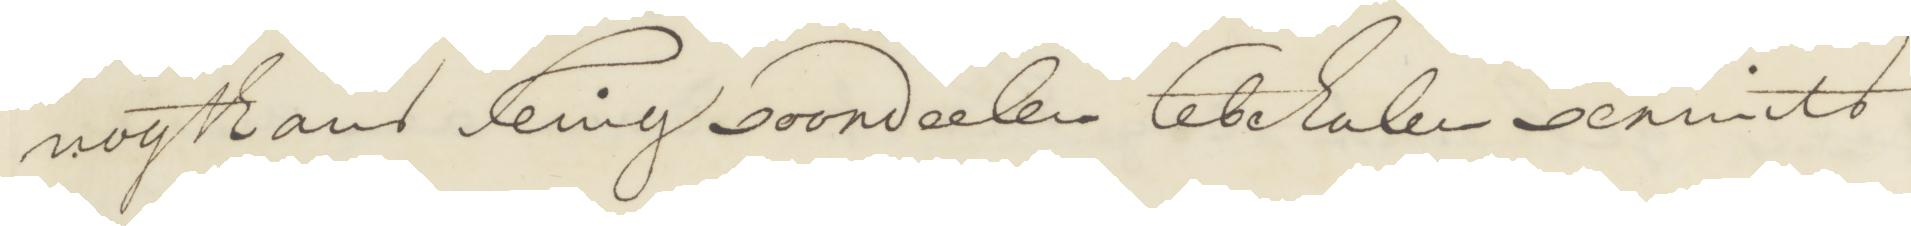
nogthans Eenig voordeelen te behalen vermits
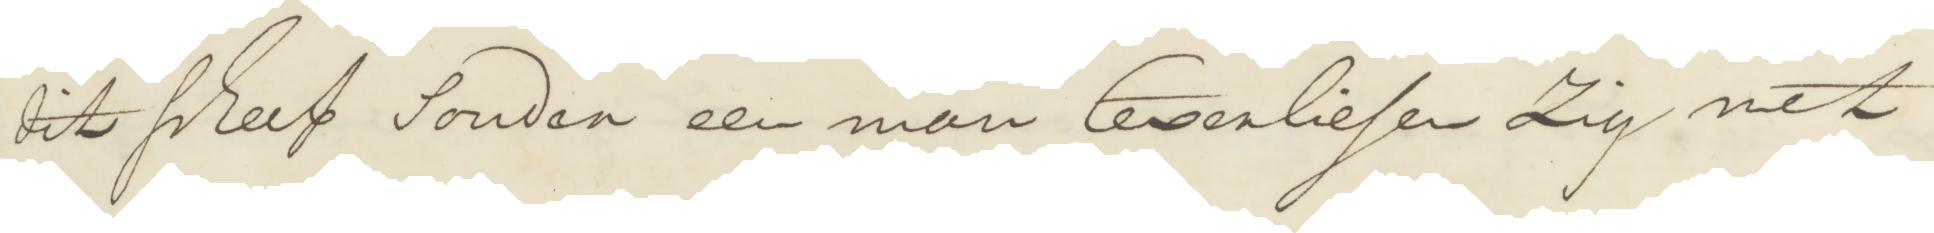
dit scheep sonder een man te verliesen Zig met
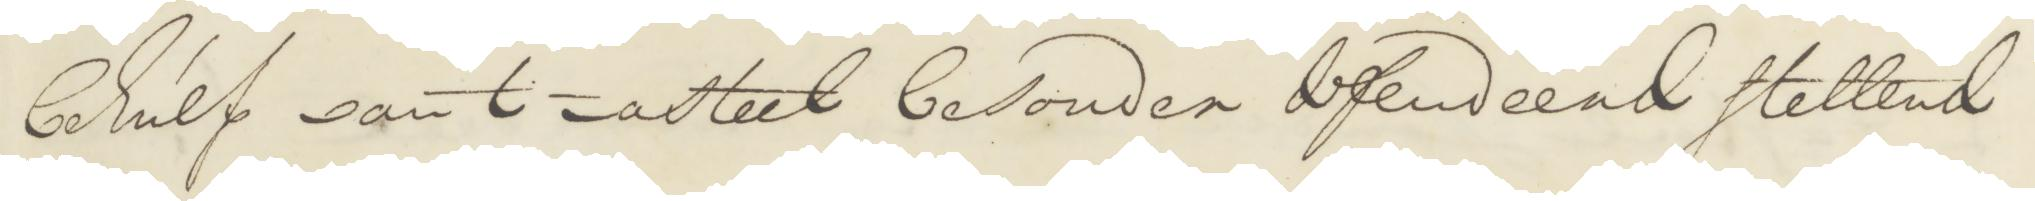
behulp van ’t casteel besonder defendeerd stellend
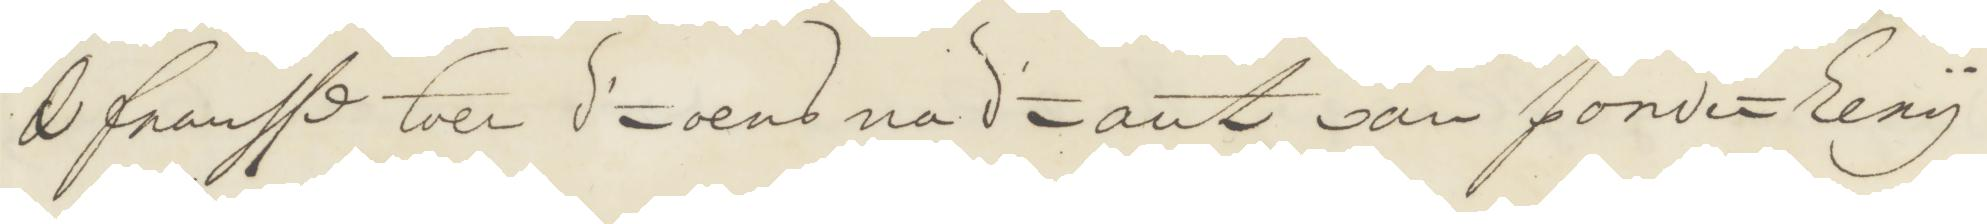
de fransse toen d'coers na d'cant van pondicherij
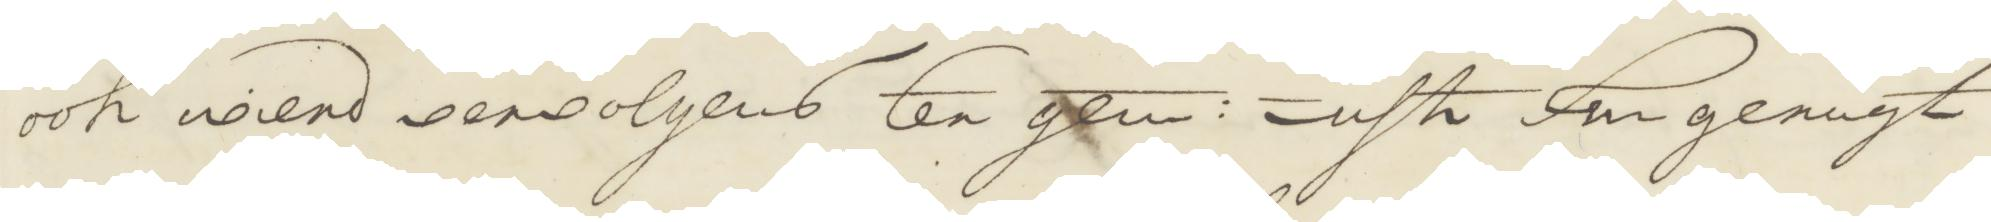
ook wierd vervolgens ter gem: custe Een gerugt
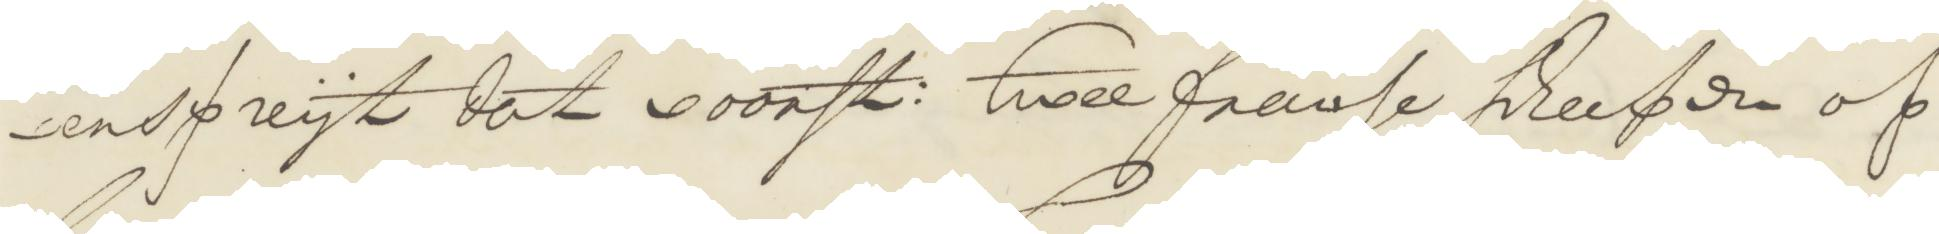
verspreijt dat voorst: twee franse scheepen op
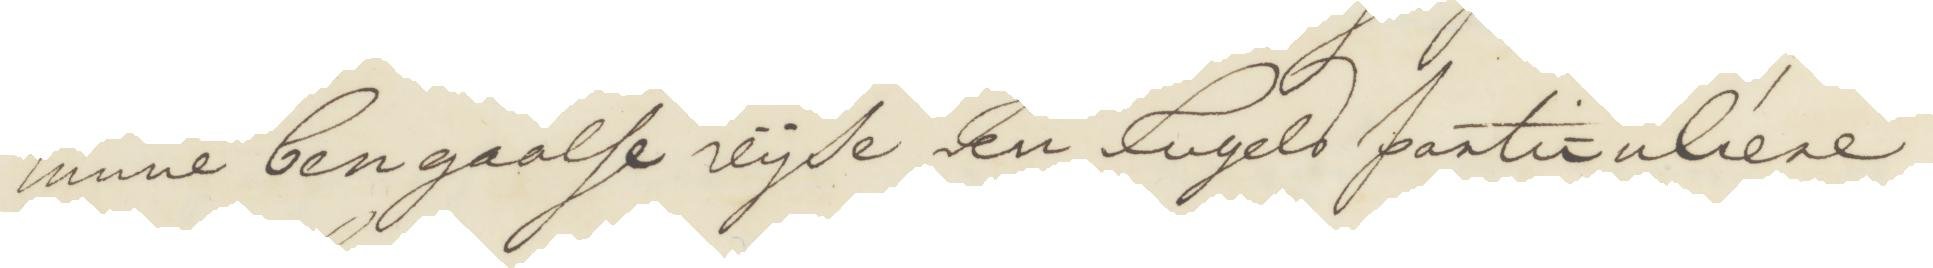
hunne bengaalse reijse een Engels particuliere
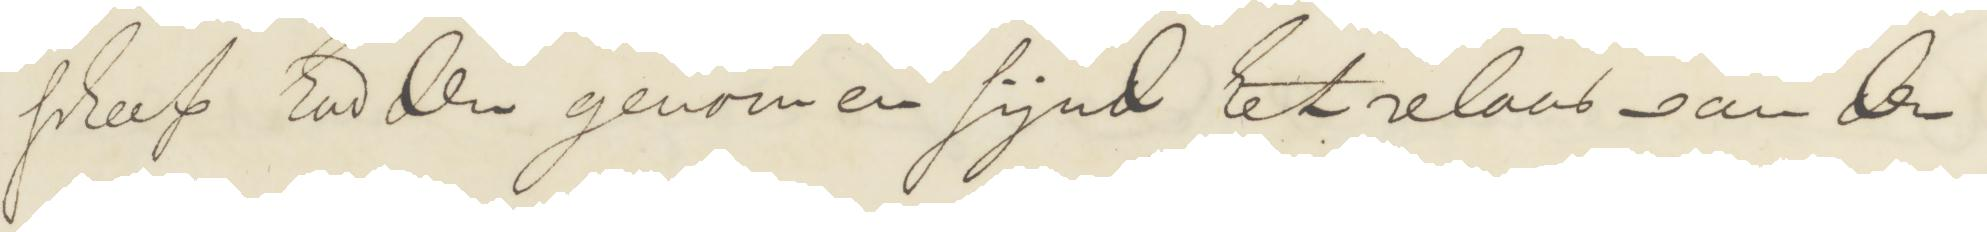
scheep hadden genomen sijnd het relaas van den
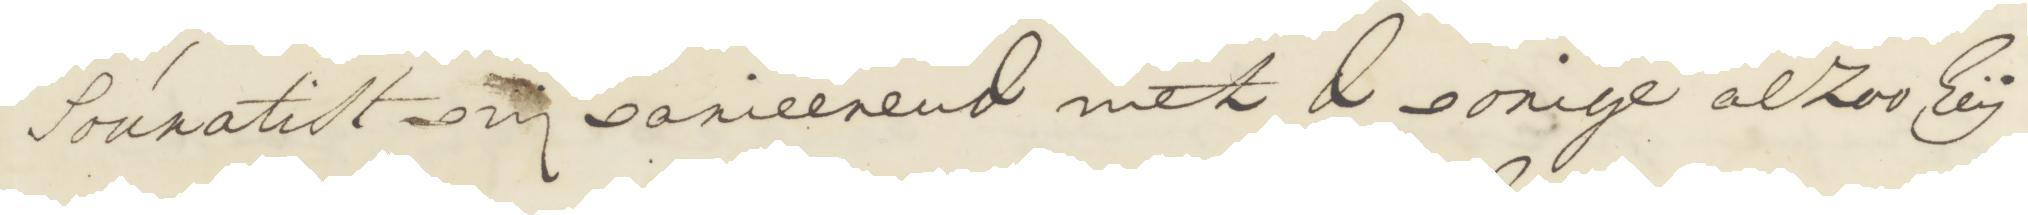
souratist vrij varieerend met de vorige alzoo heij
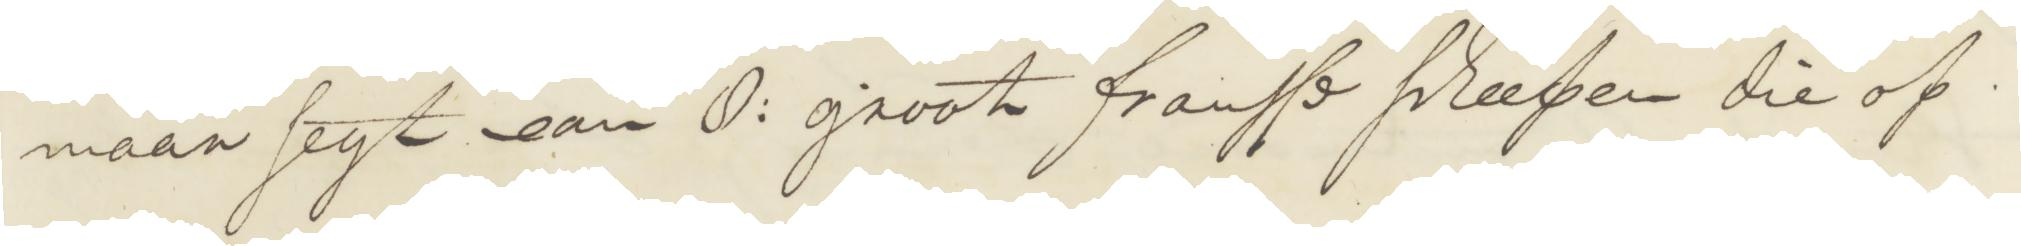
maar segt van 8: groot fransse scheepen die op
